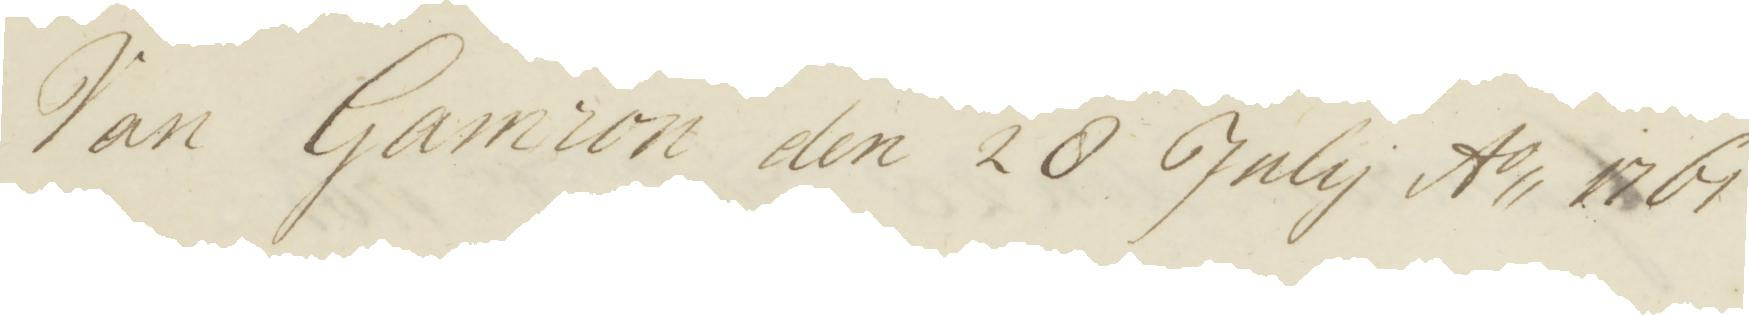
Van Gamron den 28 Julij A„o 1761
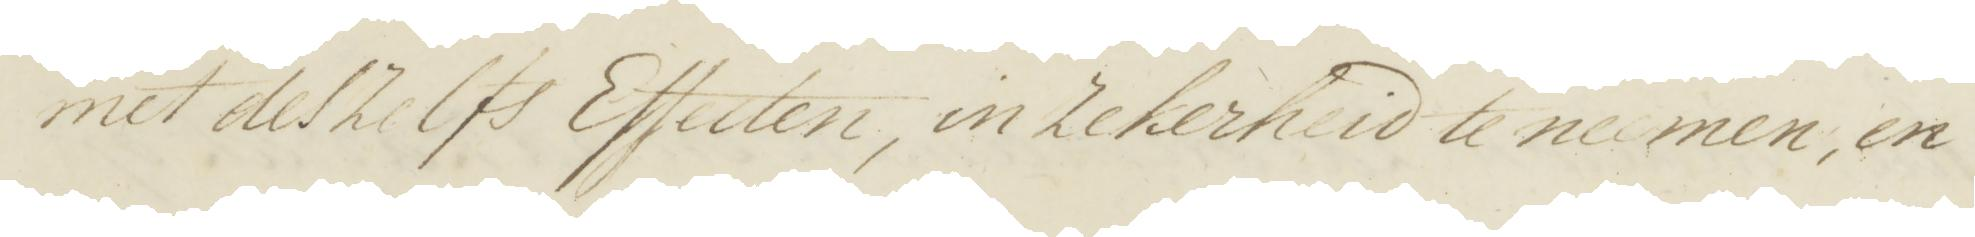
met deszelfs Effecten, in zekerheid te neemen, en
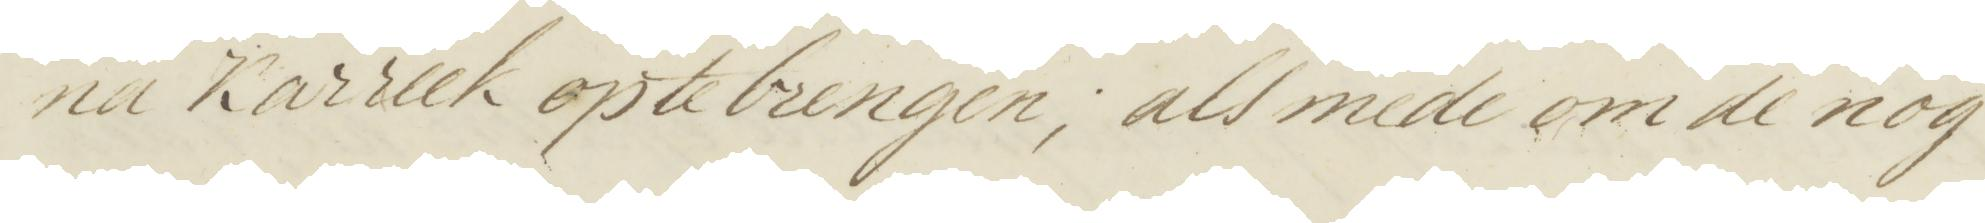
na karreek opte brengen; als mede om de nog
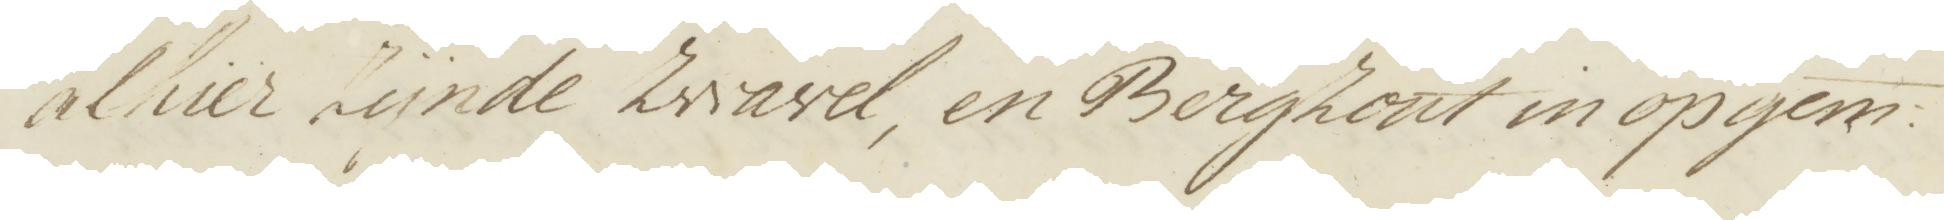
alhier zijnde zwavel, en Bergzout in opgem:
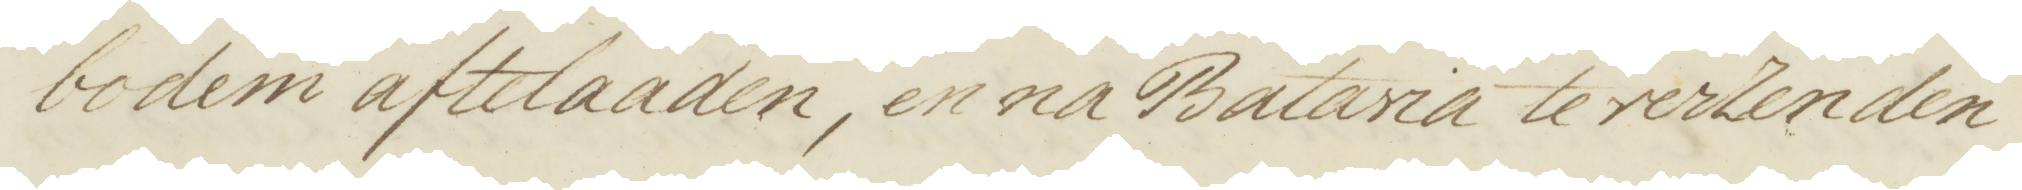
bodem aftelaaden, en na Batavia te verzenden
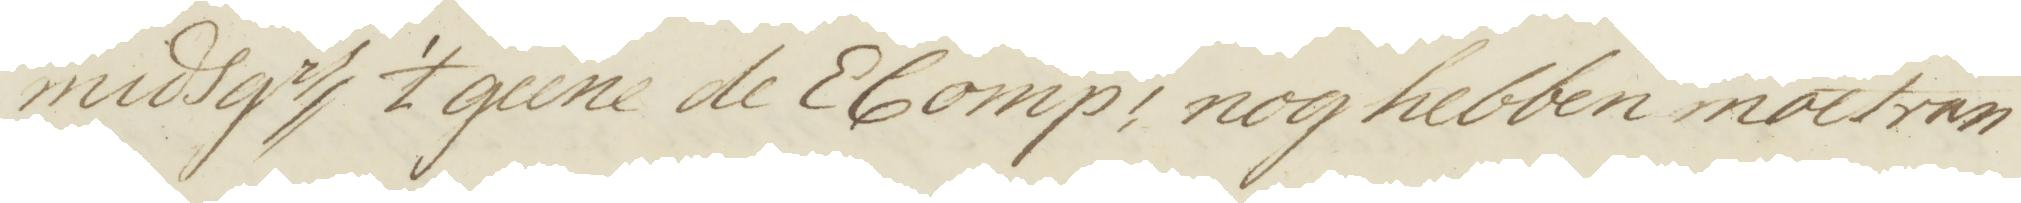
midsg„rs ’t geene de EComp„s nog hebben moet van
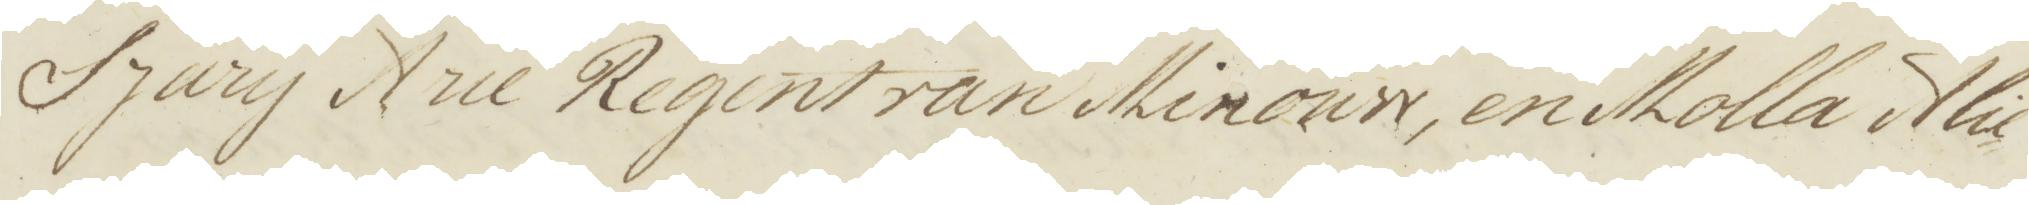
Sjarij Arie Regent van Minouw, en Molla Alie„
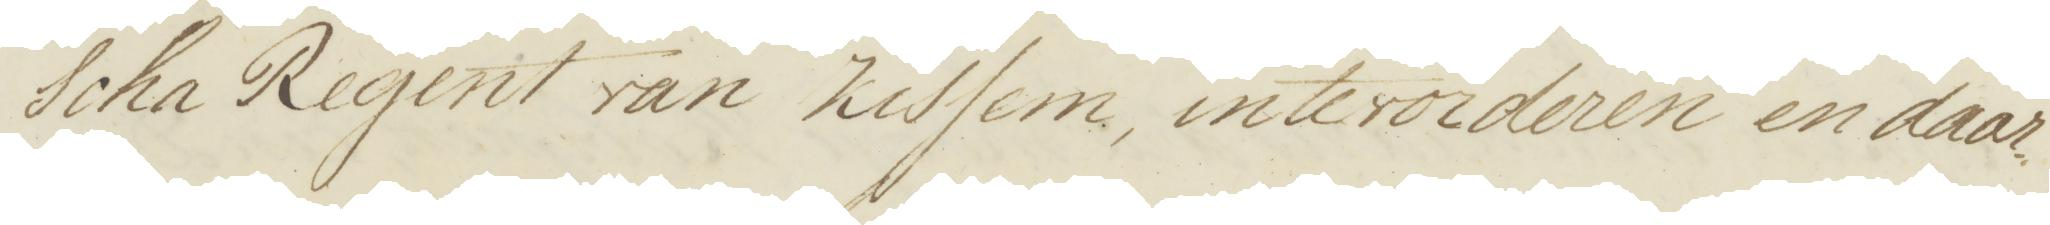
scha Regent van kissem, in te vorderen en daar„
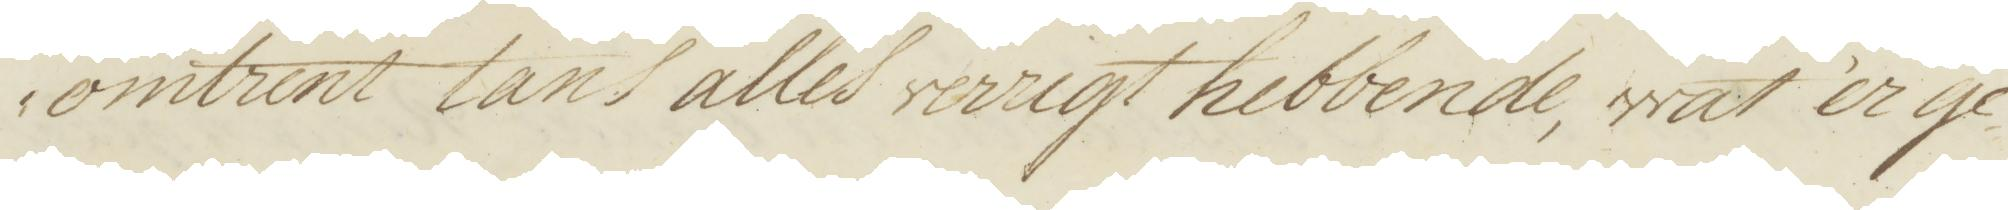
„omtrent tans alles verrigt hebbende, wat 'er ge„
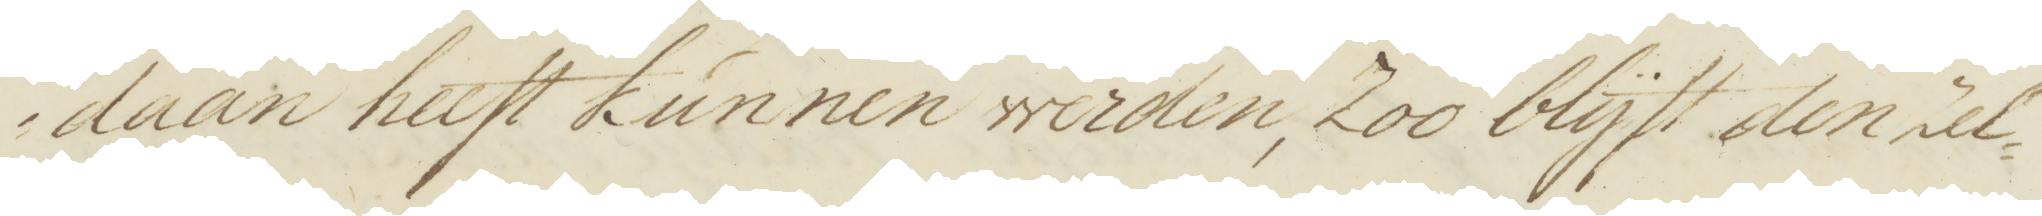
„daan heeft kunnen werden, zoo blijft den zel„
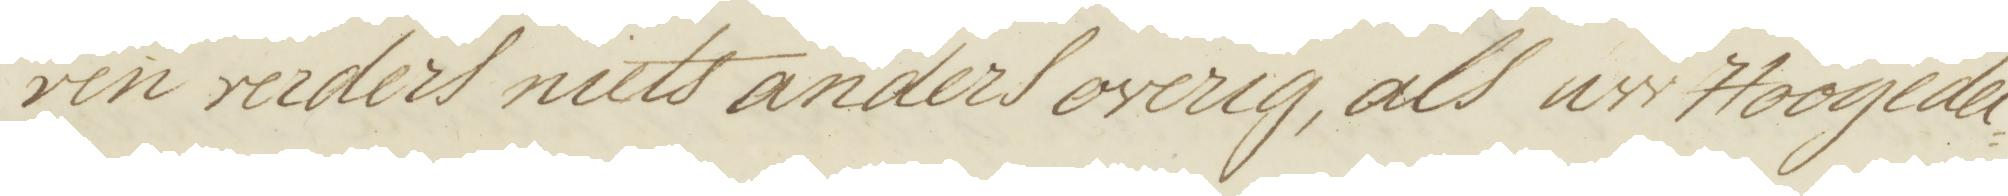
ven verders niets anders overig, als uw Hoogedel„
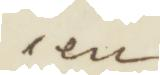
^ en
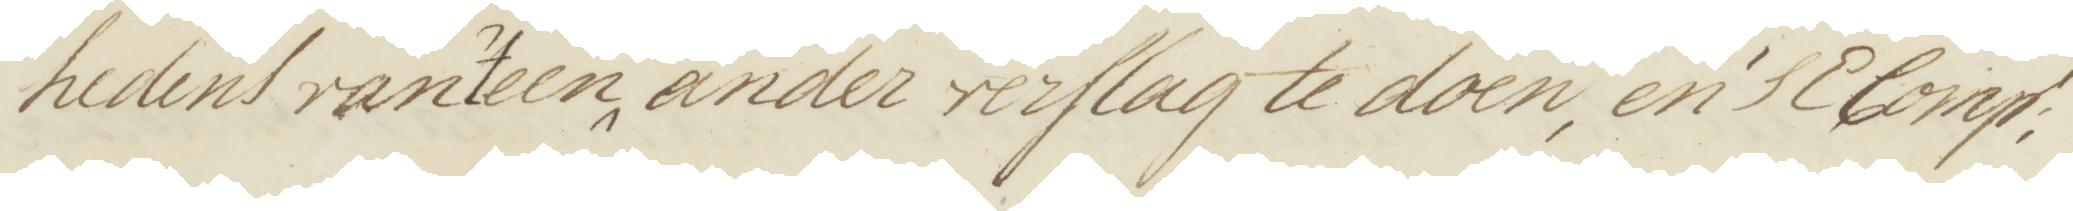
hedens van 't een ^ ander verslag te doen, en ’s EComp:s
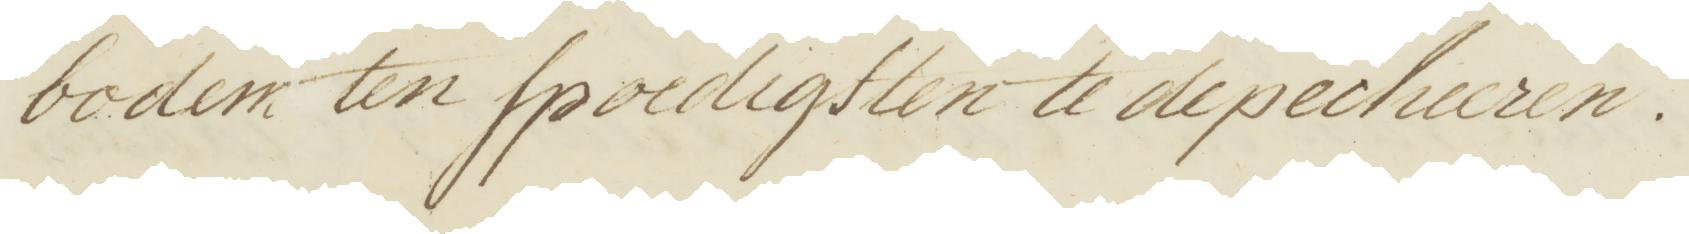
bodem ten spoedigsten te depecheeren.
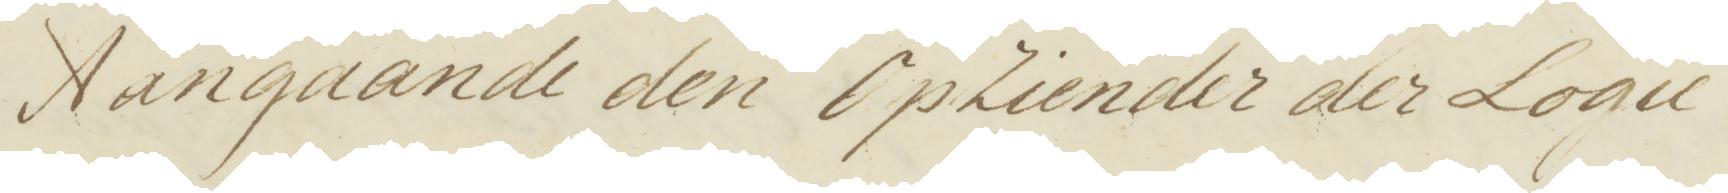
Aangaande den Opziender der Logie
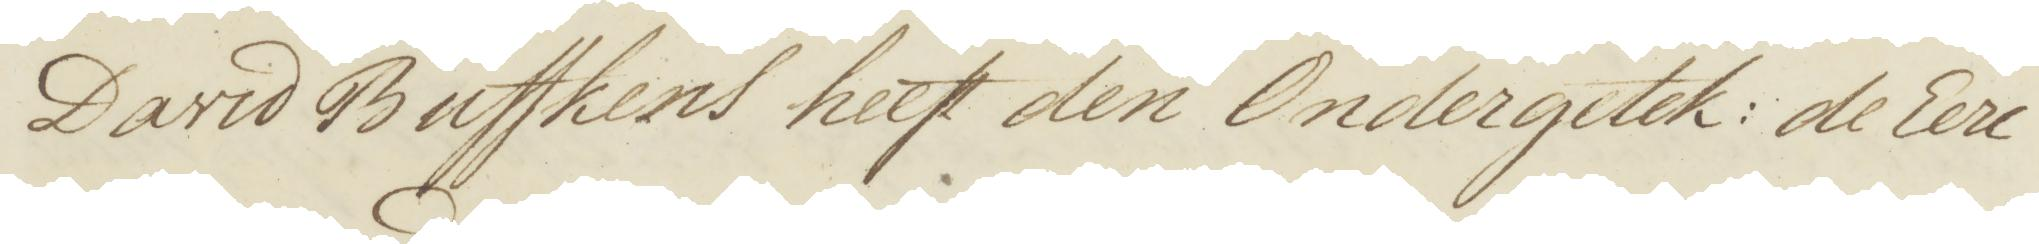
David Buffkens heeft den Ondergetek: de Eere
